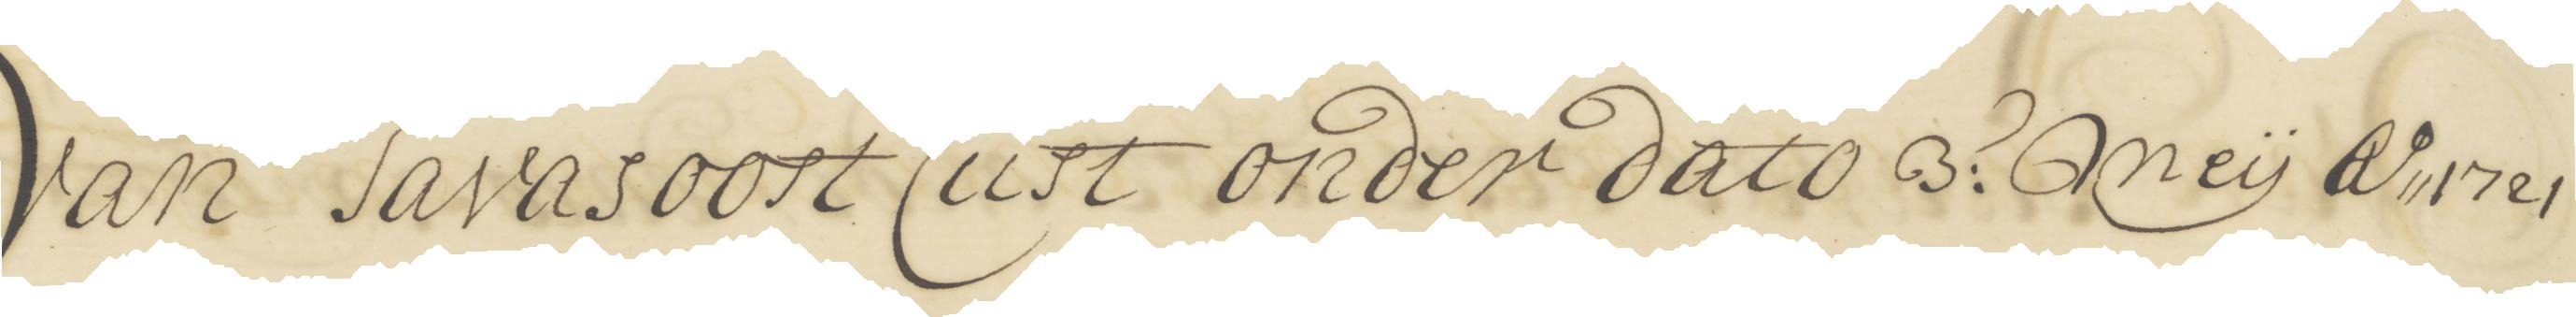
Van Iavas oost Cust onder dato 3:' Meij A„o 1721
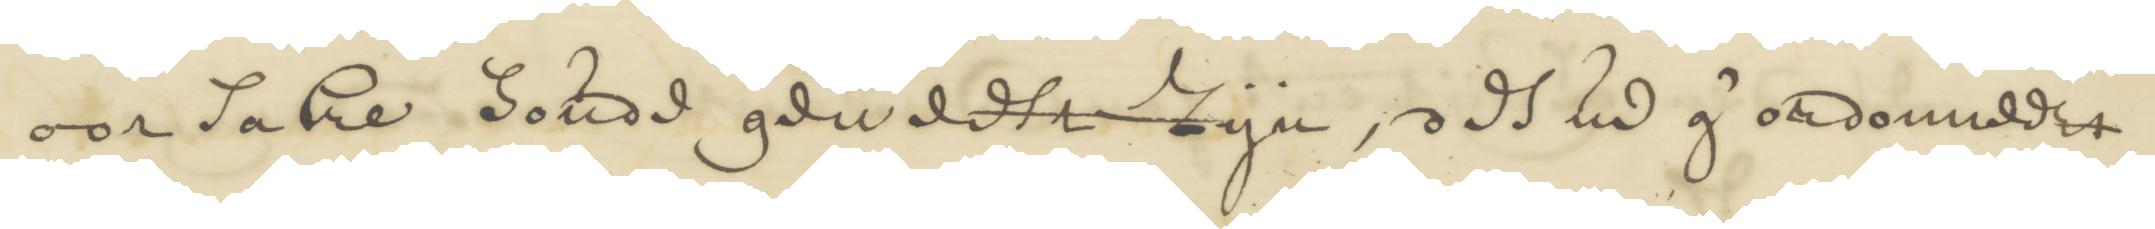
oor sake soude geweest zijn, des u e g’ordonneert
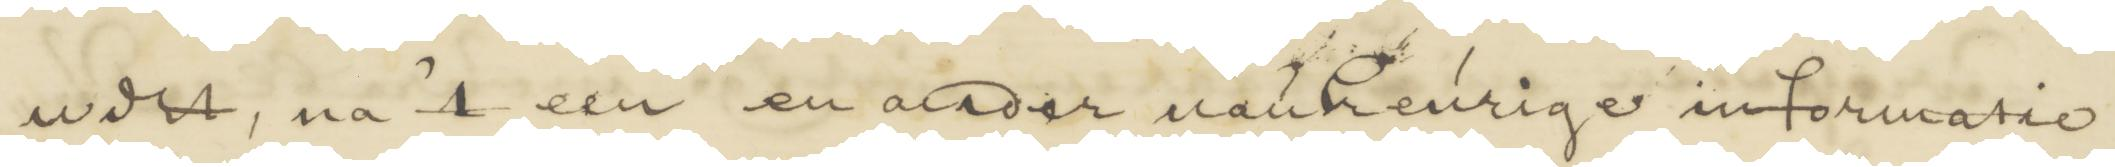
wert, na 't een en ander naukeurige informatie
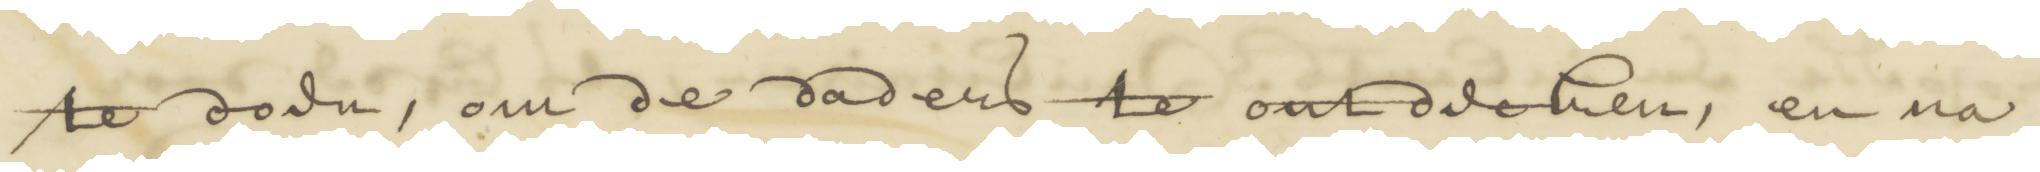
te doen, om de daders te ontdecken, en na
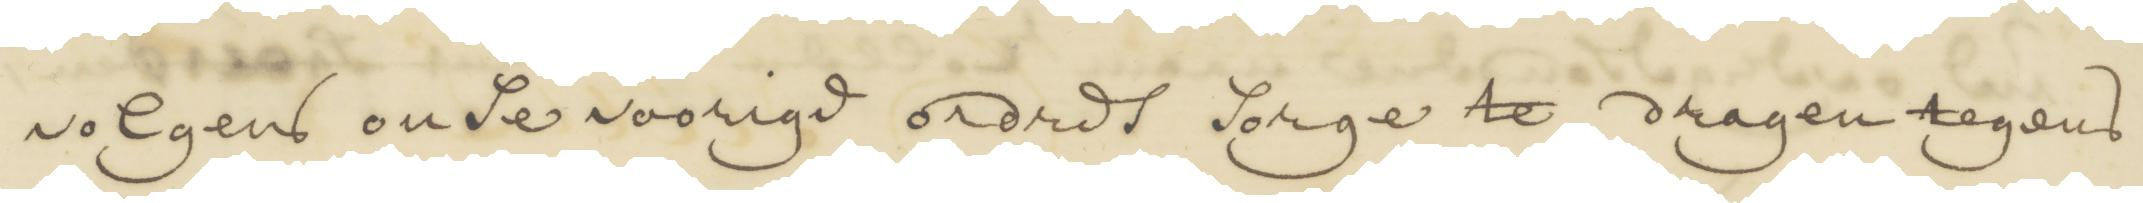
volgens onse voorige ordres sorge te dragen tegens
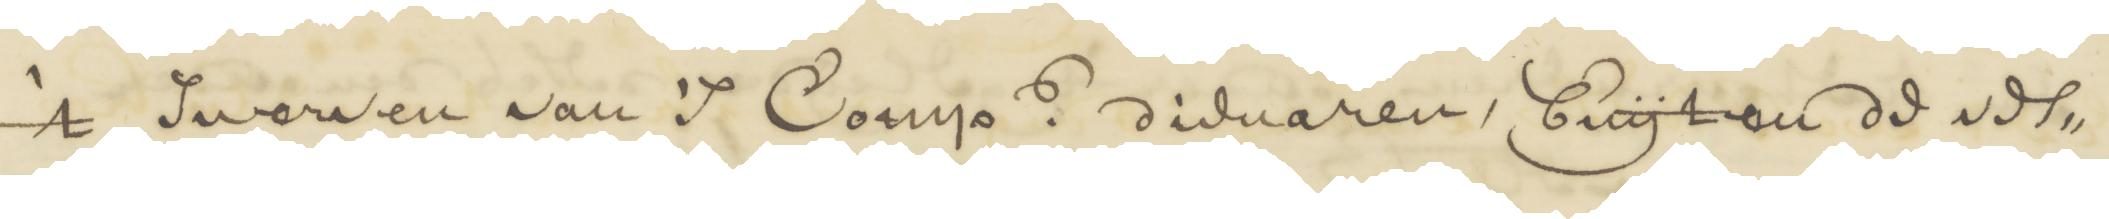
’t swerven van ’s Comp.s dienaren, buijten de ves„
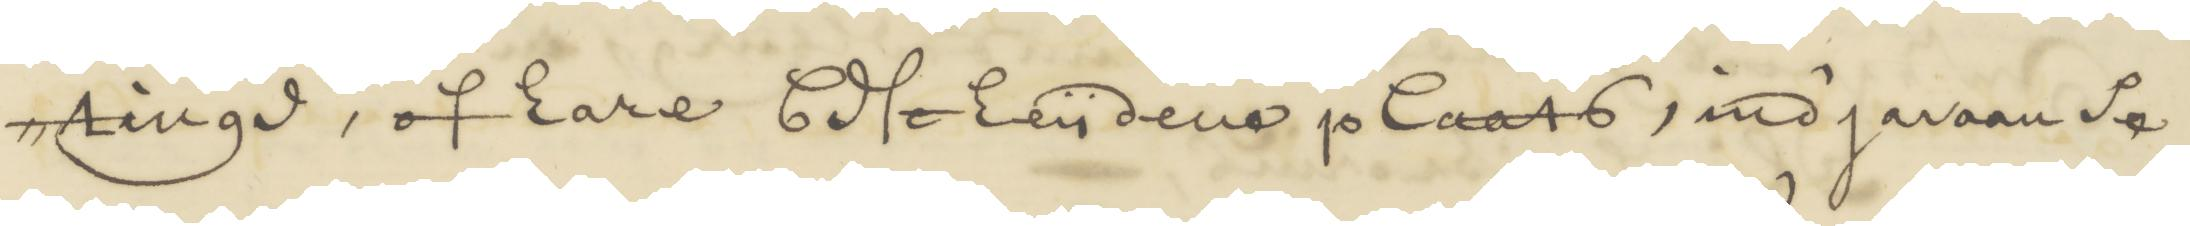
„tinge, of hare bescheijdene plaats, ind' javaanse
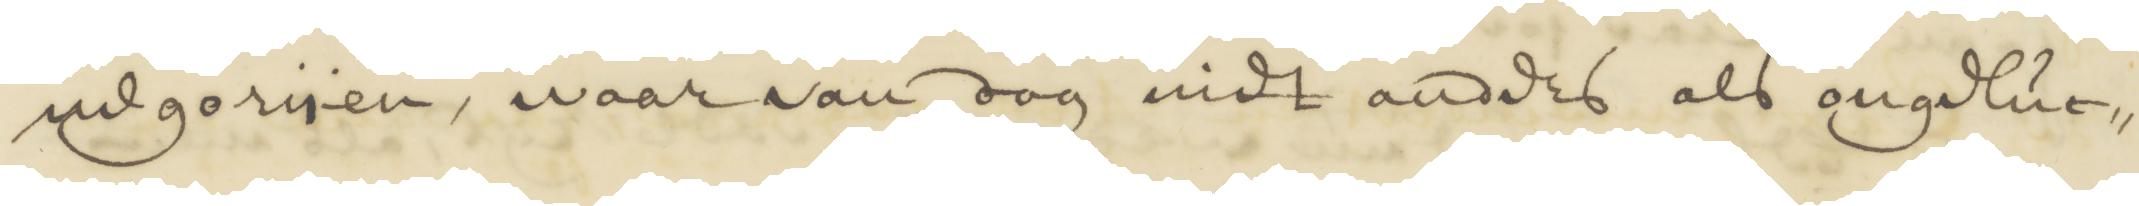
negorijen, waar van dog niet anders als ongeluc„
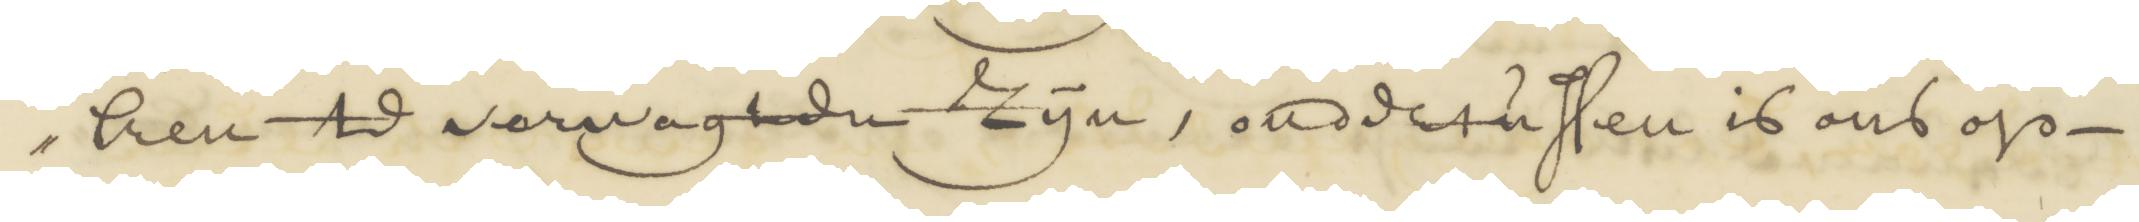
„ken te verwagten zijn, ondertussen is ons op —
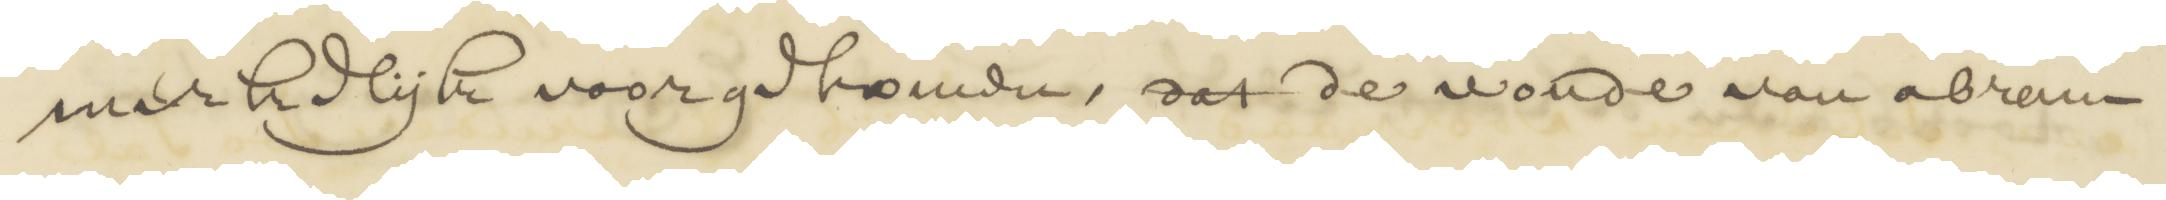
merkelijk voor gekomen, dat de wonde van abram
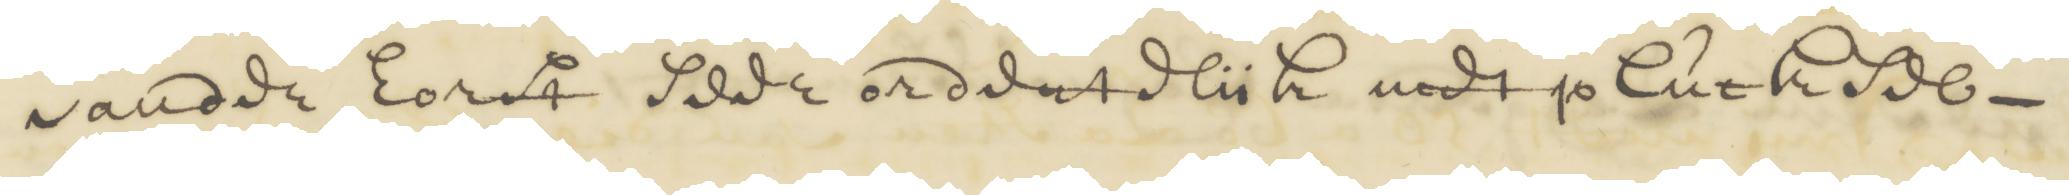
vander horst seer ordentelijk met plutksel —
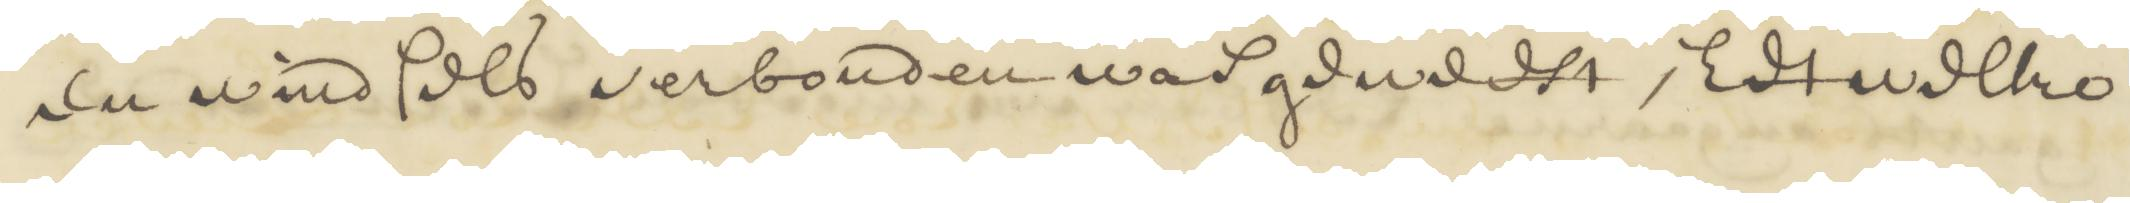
en windsels verbonden was geweest, het welke
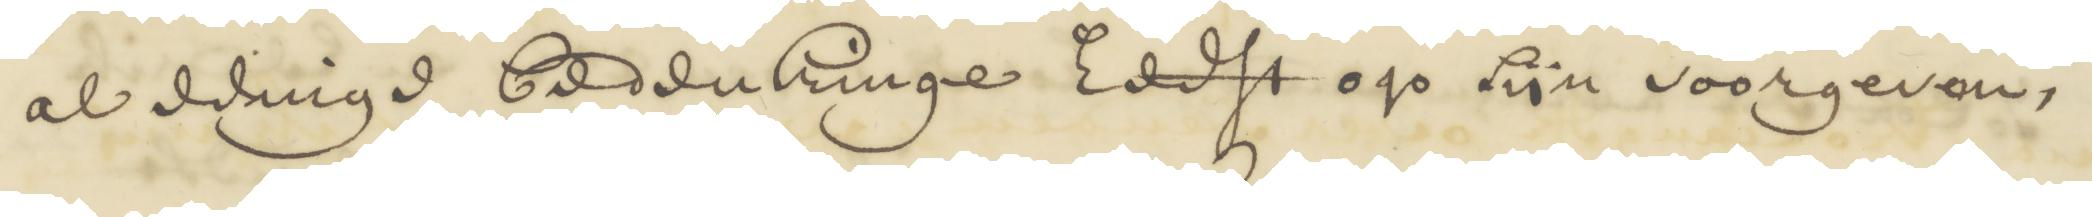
al eenige bedenkinge heeft op sijn voorgeven,
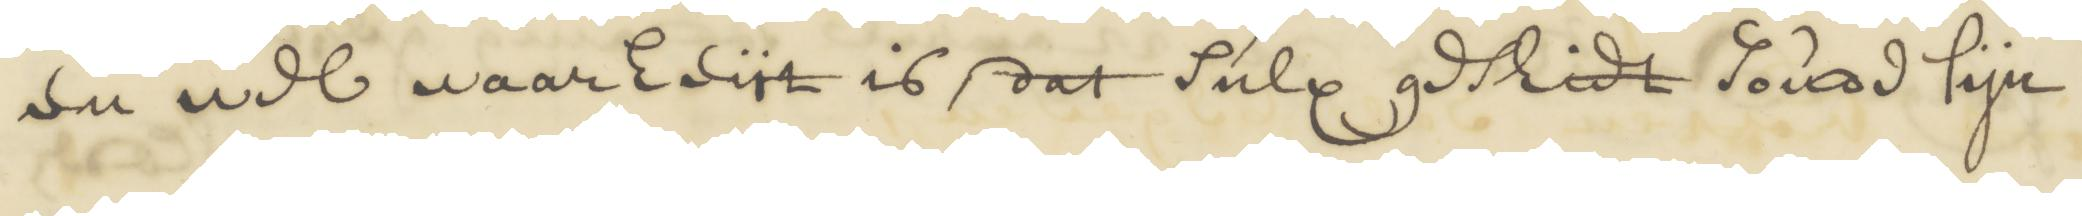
en wel waarheijt is, dat sulx geshiet soude sijn
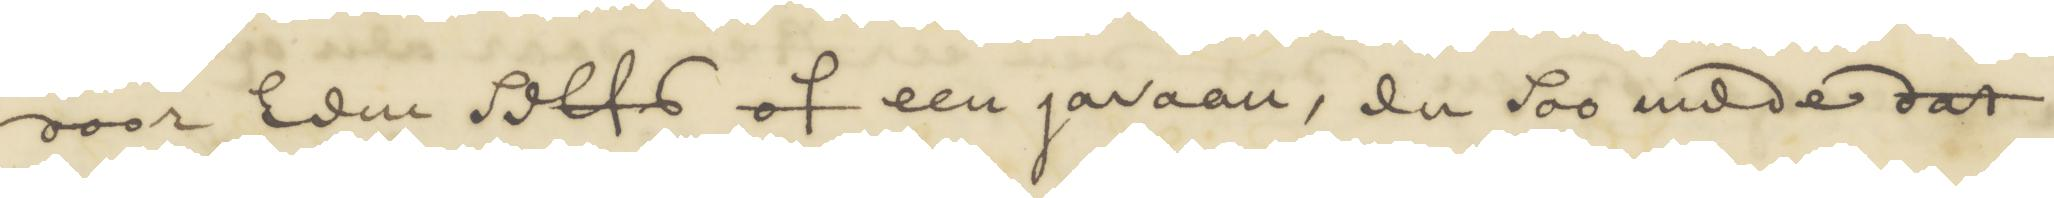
door hem selfs of een javaan, en soo mede dat
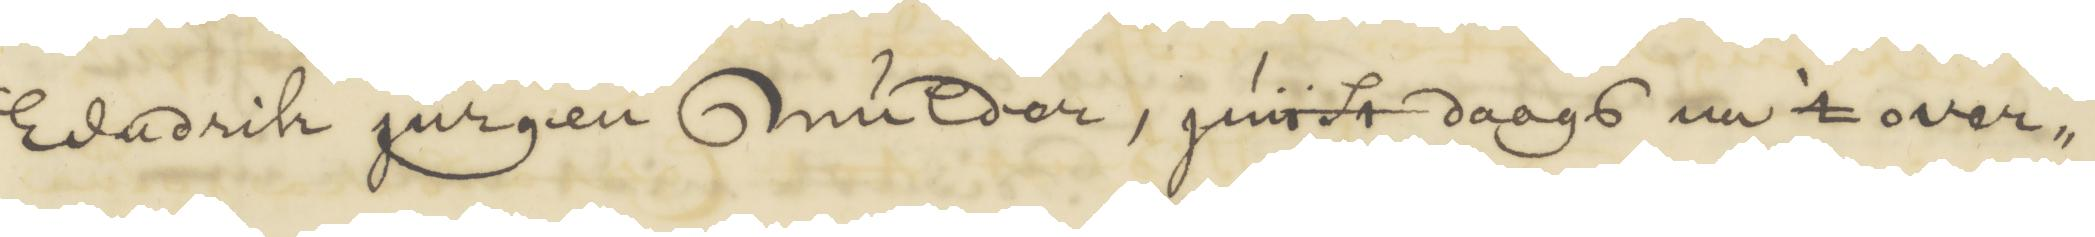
hendrik jurgen Mulder, juijst daags na ’t over„
